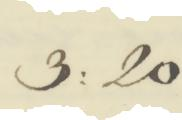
3: 20
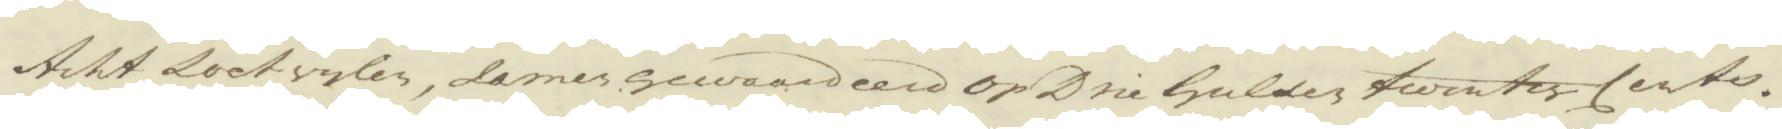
Acht zoet vijlen, zamen gewaardeerd op Drie Gulden twintig Cents.
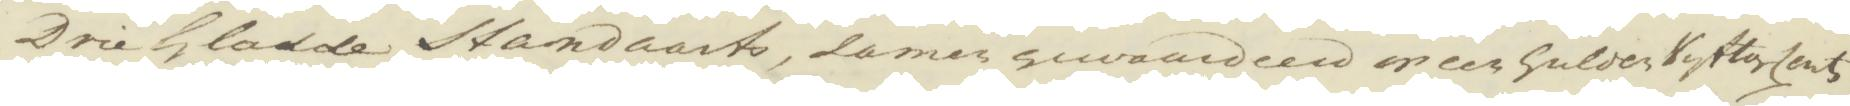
Drie Gladde Standaarts, zamen gewaardeerd op een Gulden Vyftig Cents
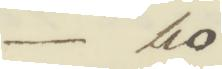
— 40
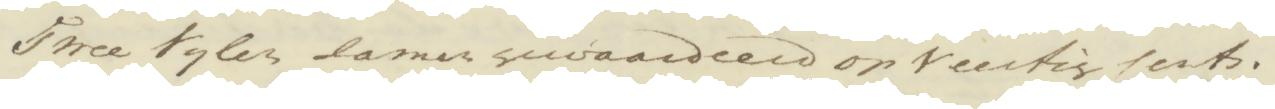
Twee Vylen zamen gewaardeerd op Veertig Cents.
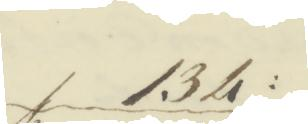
134:
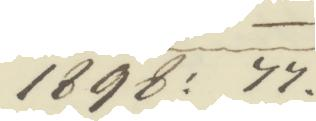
1898: 77
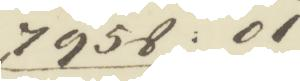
7958: 01
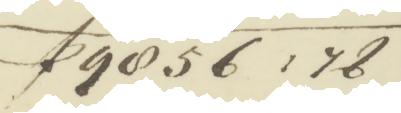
ƒ9856:78
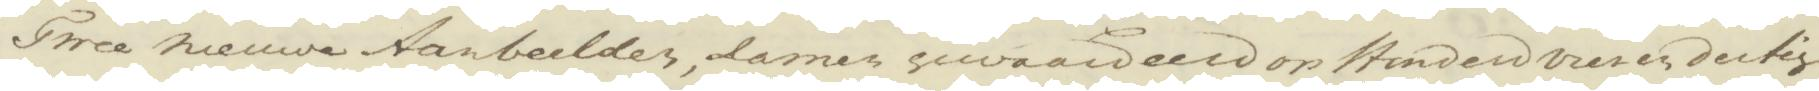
Twee nieuwe Aanbeelden, zamen gewaardeerd op Honderd vier en dertig
